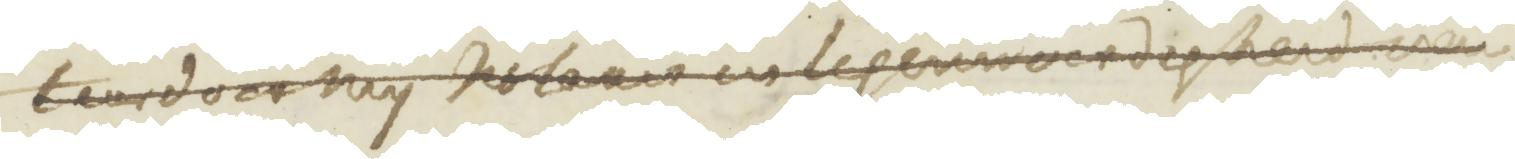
teur door my notaris in tegenwoordigheid van
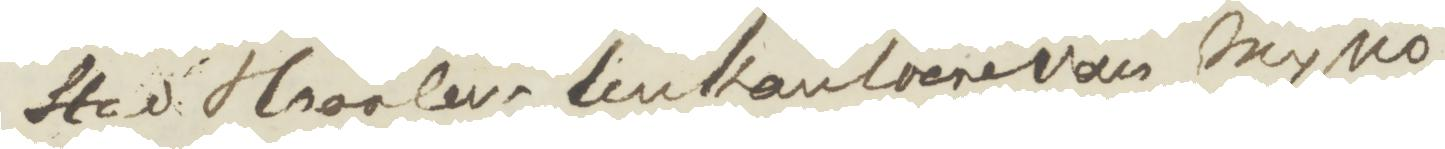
Stad Haarlem ten kantoore van my not
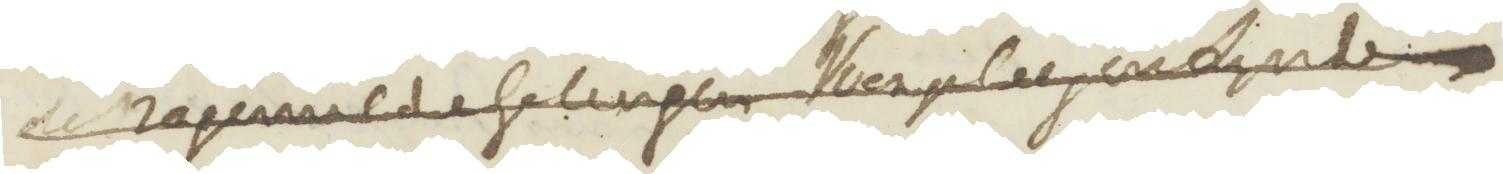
de nagemelde getuigen Voor geleegen zynde
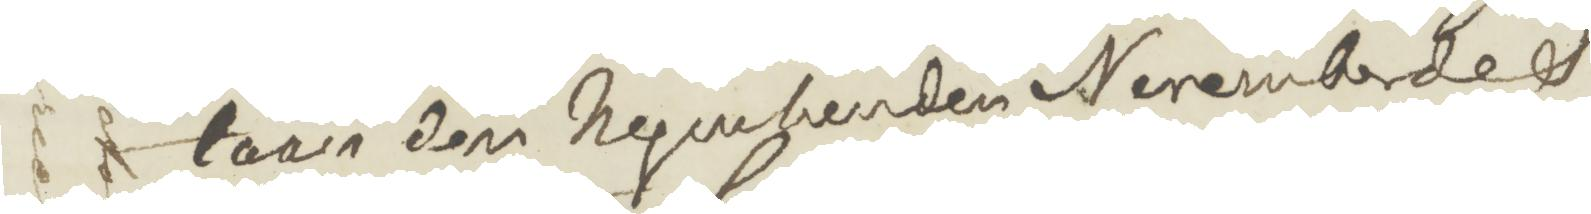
taris den Negentienden November des
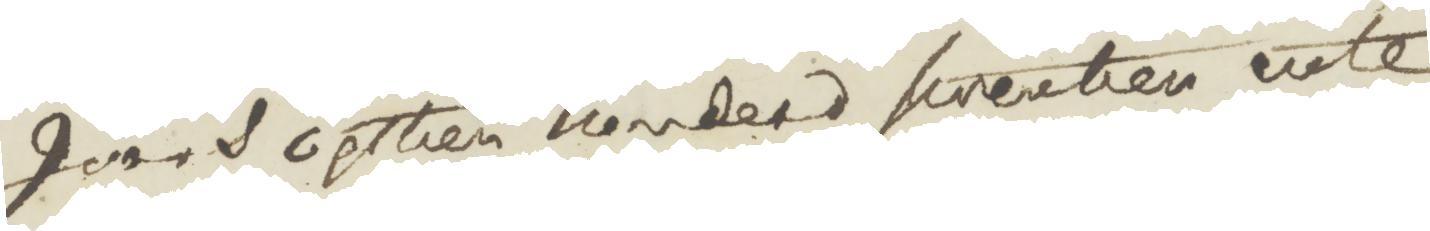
Jaars agttien honderd seventien inte
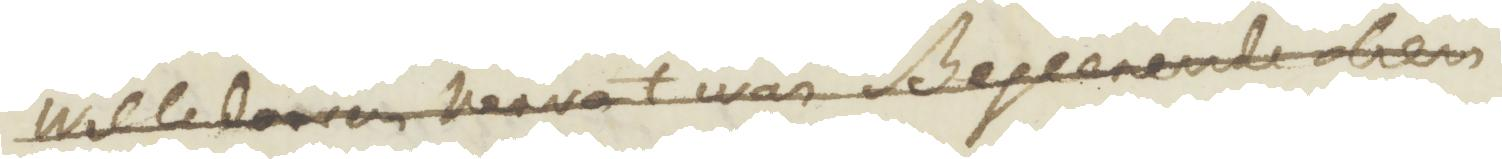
wille daar in vervat was Begeerende dien
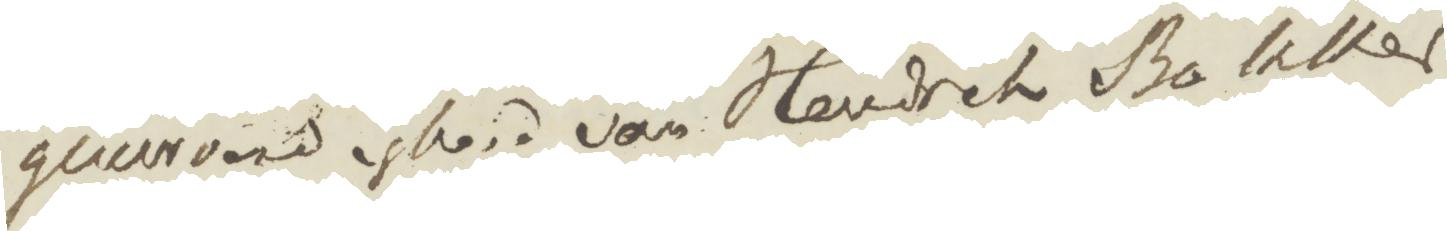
genwoordigheid van Hendrik Bakker
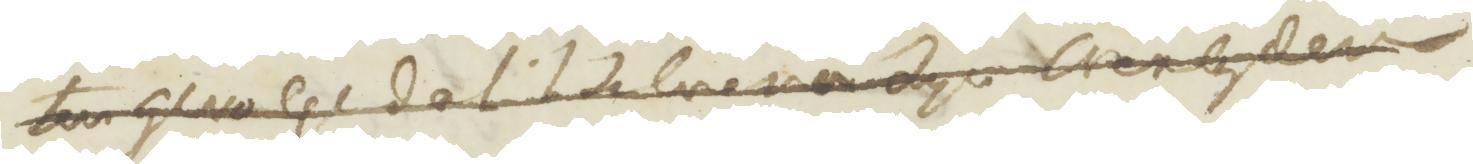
ten gevolge dat 't zelve na zyn overlyden
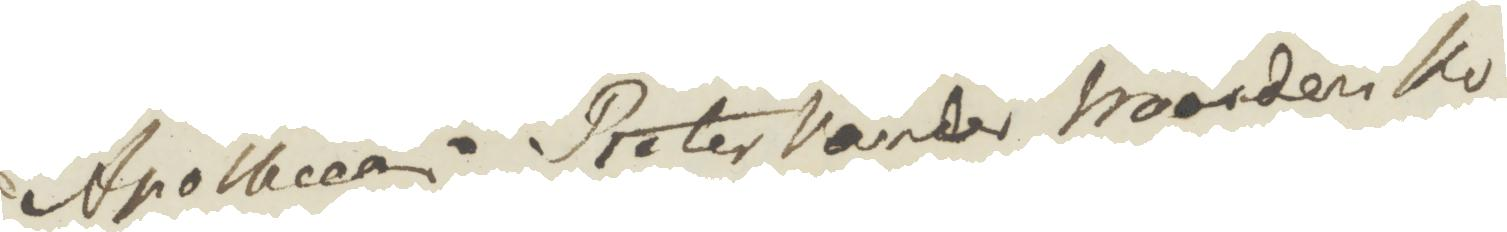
Apothecer Pieter Vande Waarden Ko
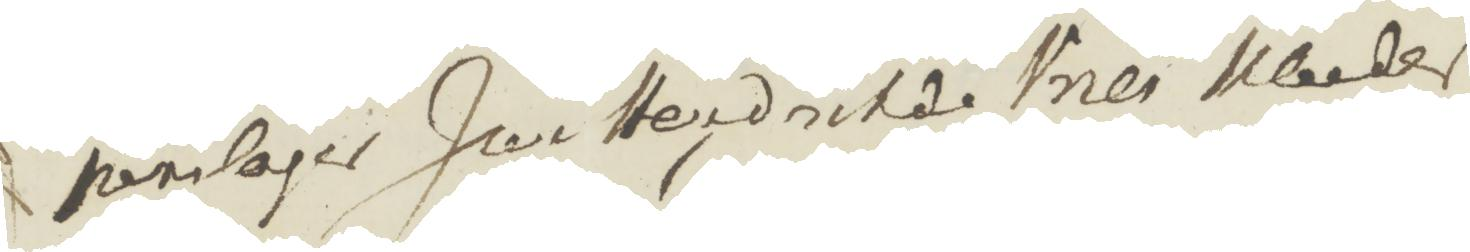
perslager Jan Hendrik de Vries Kleeder
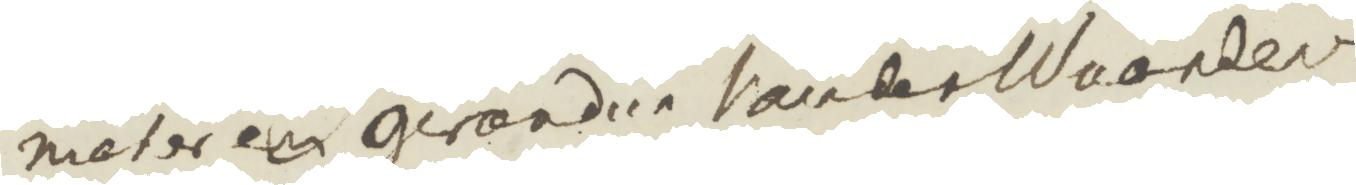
maker en gerardus Vander Waarden
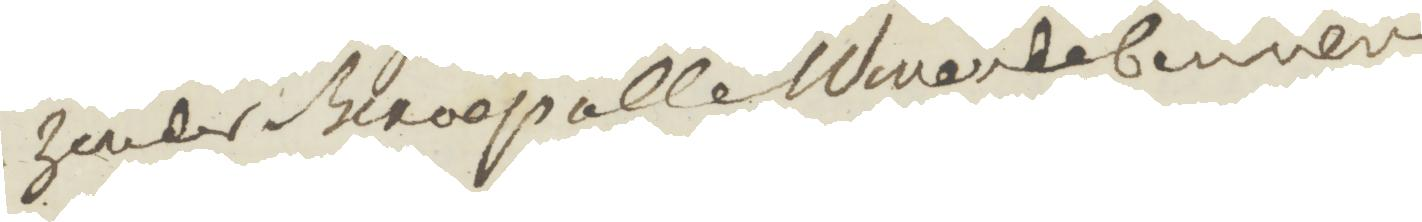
zelver Beroep alle Wonende binnen
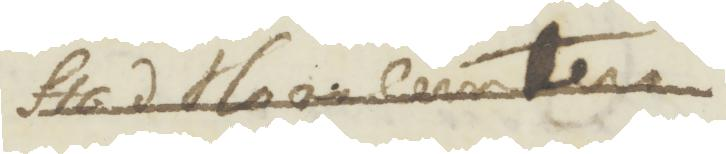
Stad Haarlem ten
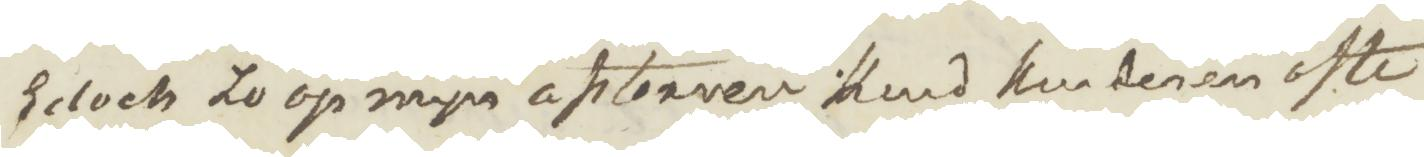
Schoon zo op myn afsterven kind kinderen ofte
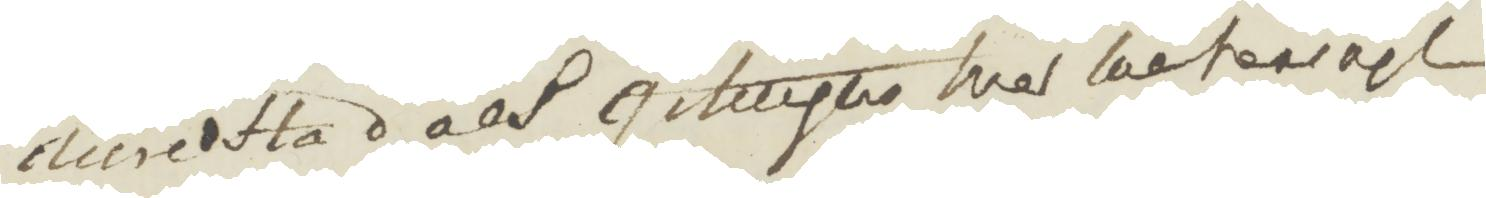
deese stad als getuigen wel laeten opl
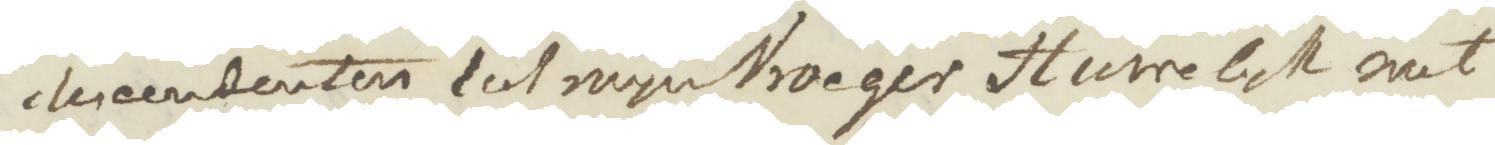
descendenten uit myn Vroeger Huwelyk met
